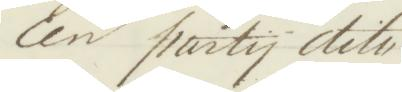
Een partij dito
